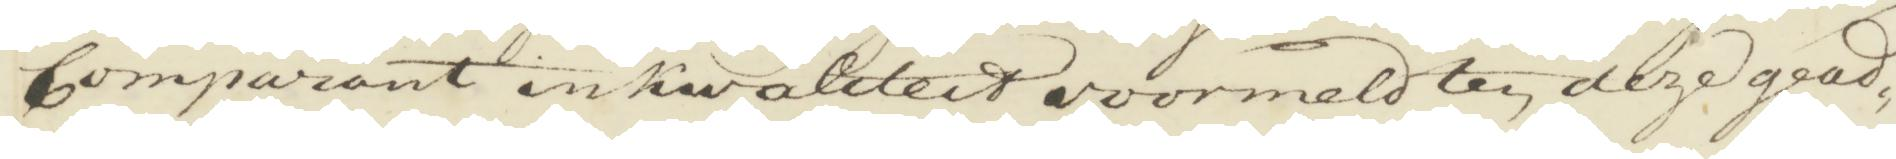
Comparant in kwaliteit voormeld ten deze gead„
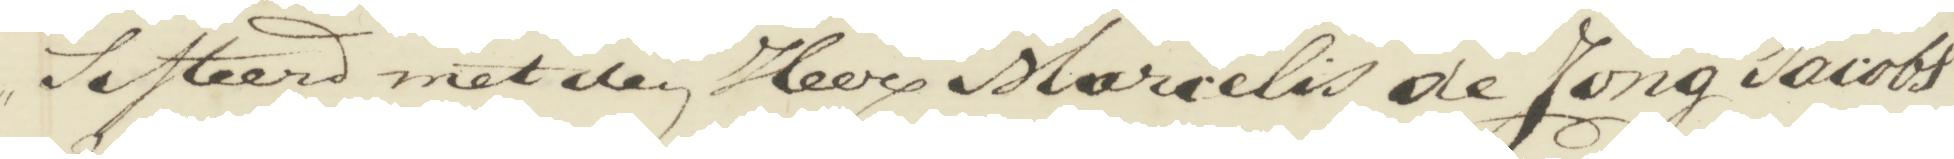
„sisteerd met den Heer Marcelis de Jong Iacobs
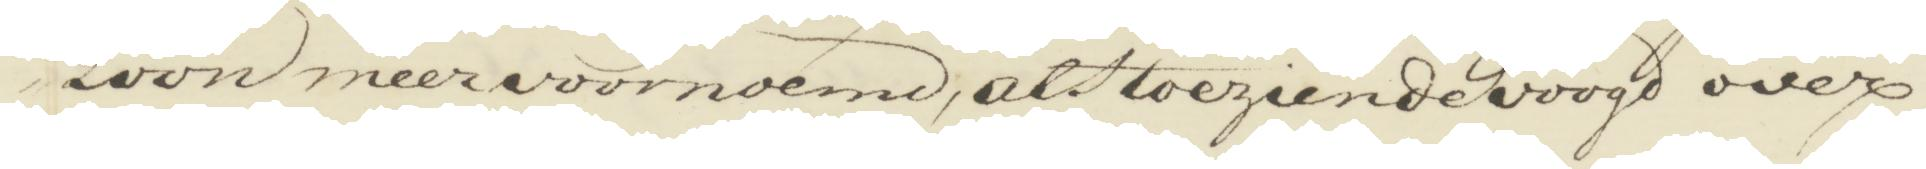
„zoon meervoornoemd, als toeziende voogd over
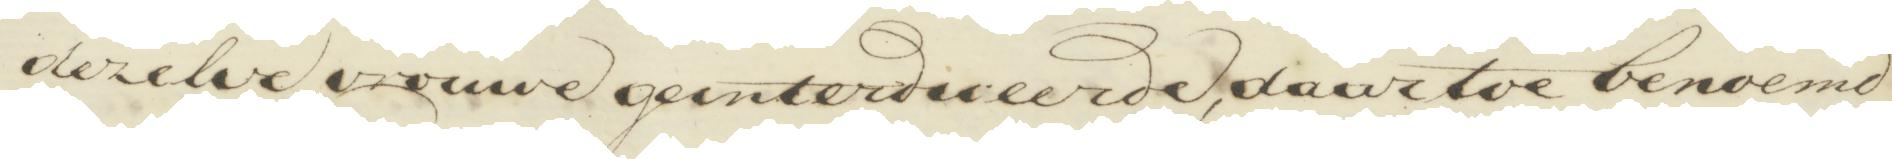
dezelve vrouwe geinterdiceerde, daar toe benoemd
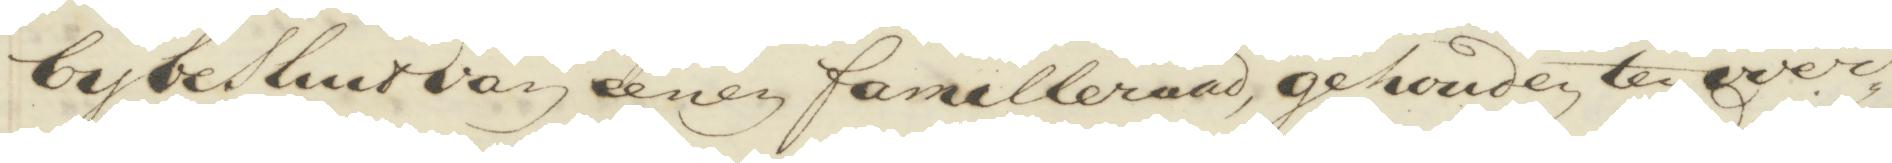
by besluit van eenen familleraad, gehouden ten over„
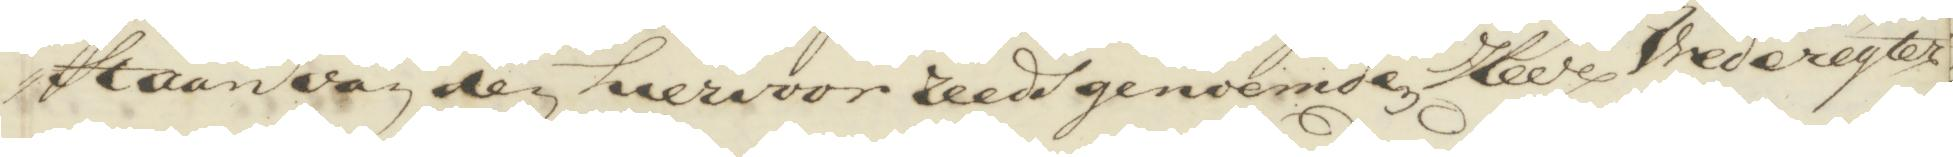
„staan van den hiervoor reeds genoemden Heer Vrederegter
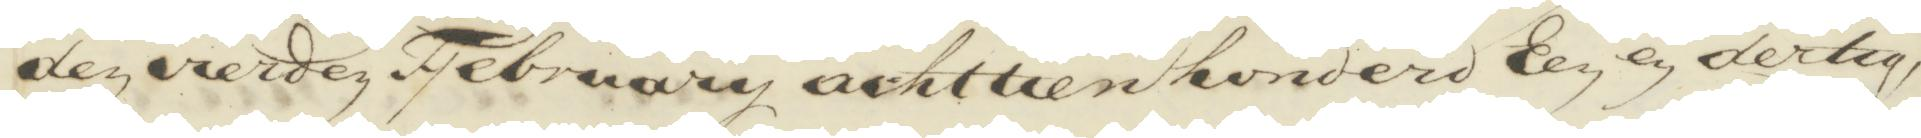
den vierden February achttien honderd Een en dertig,
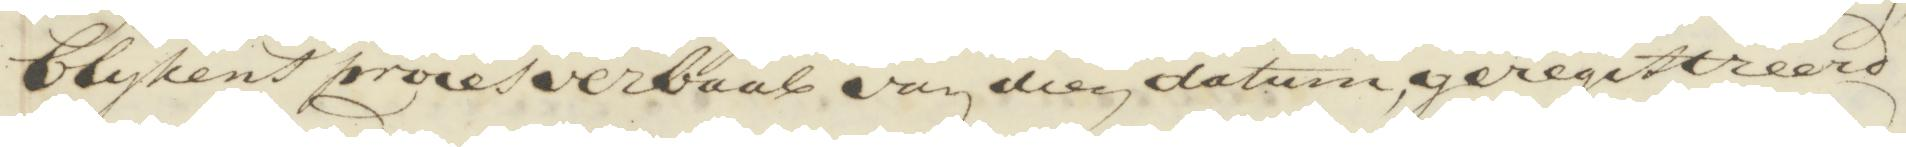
blykens procesverbaal van dien datum, geregistreerd
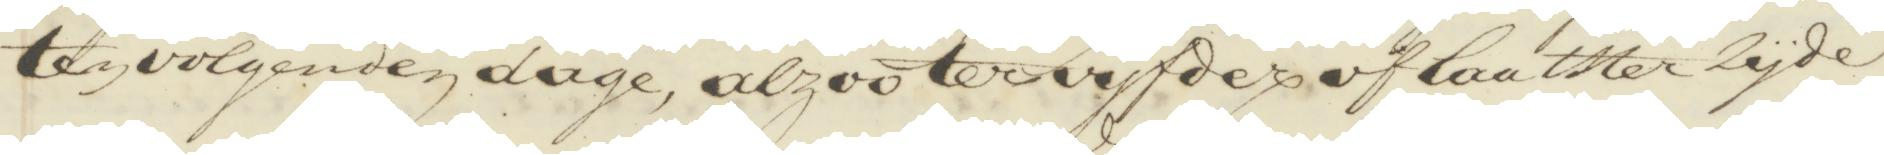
ten volgenden dage, alzoo ter vijfder of laatster zijde
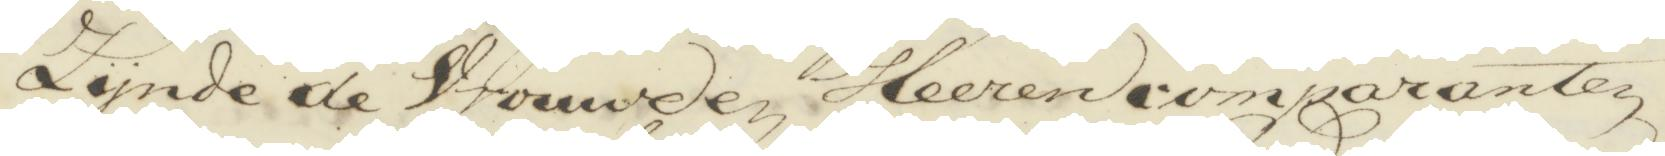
Zijnde de Vrouwe en Heeren comparanten
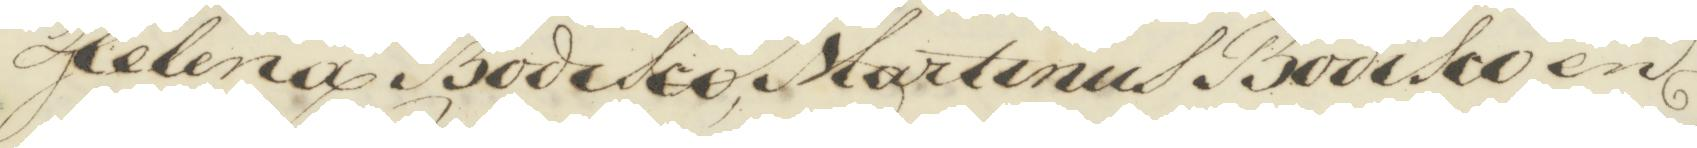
Helena Bodisco Martinus Bodisco en
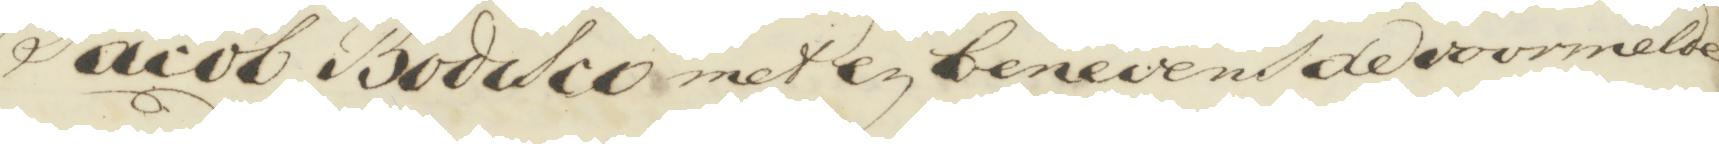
Iacob Bodisco met en benevens de voormelde
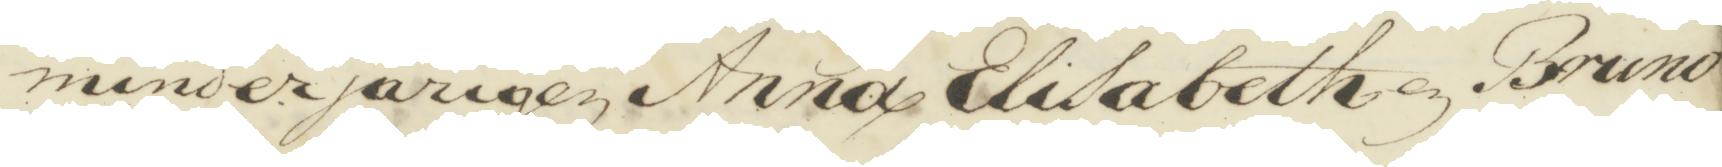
minderjarigen Anna Elisabeth en Bruno
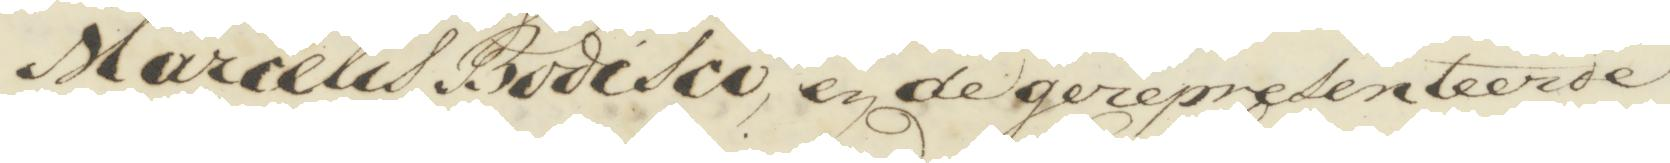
Marcelis Bodisco, en de gerepresenteerde
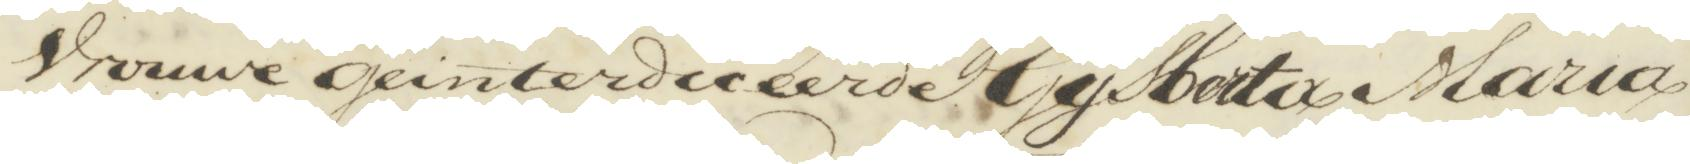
Vrouwe geinterdiceerde Gijsberta Maria
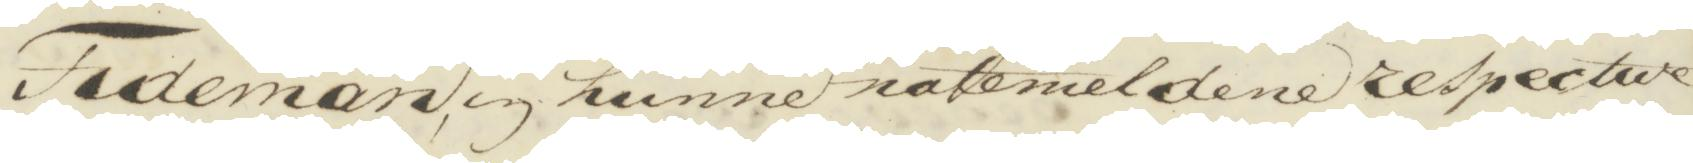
Tideman, in hunne natemeldene respective
